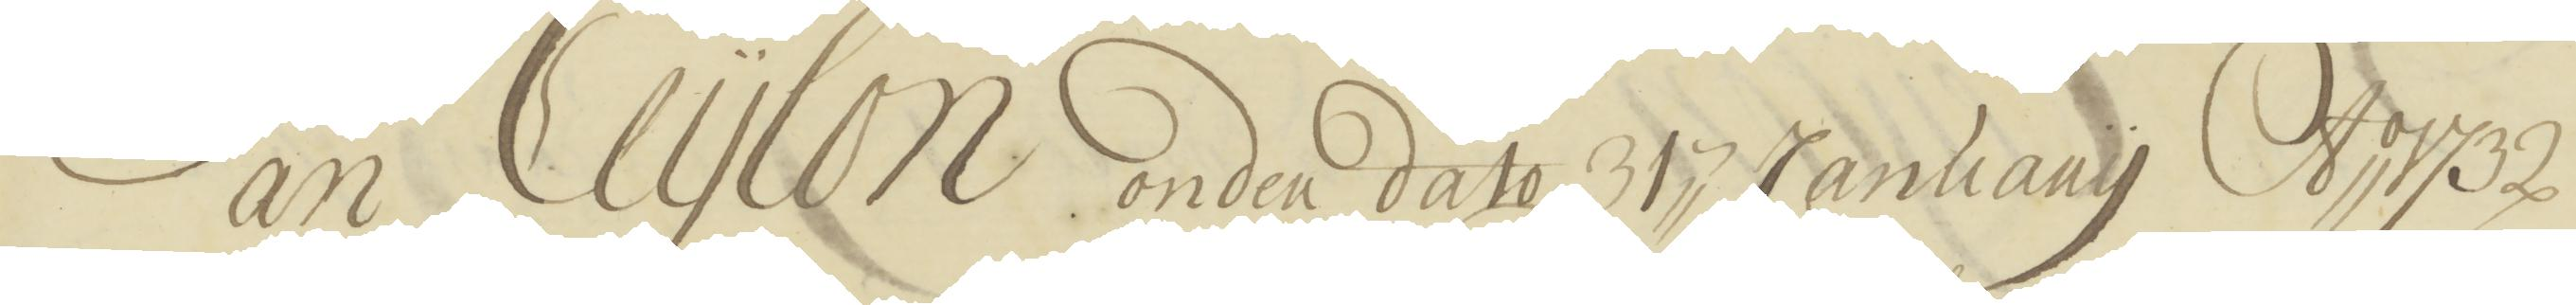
Van Ceijlon onder dato 31„en Januarij A„o 1732
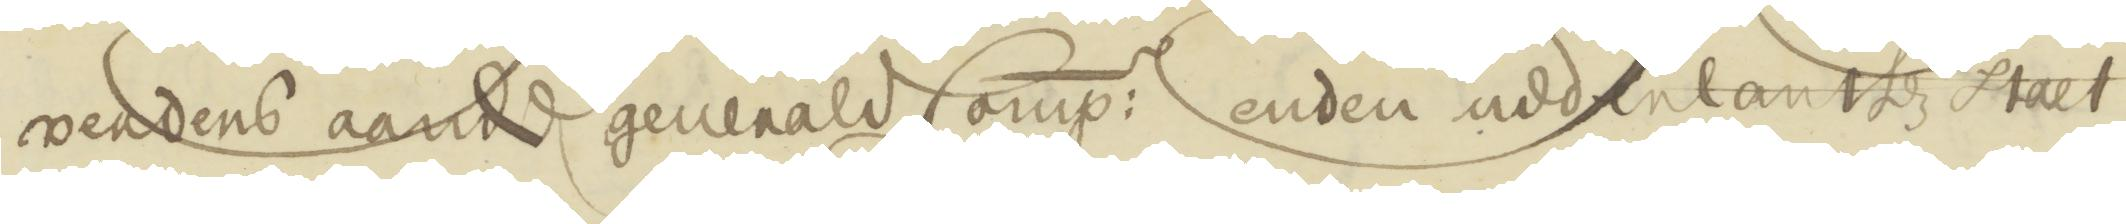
verders aan de generale Comp:e enden nederlantsen staet
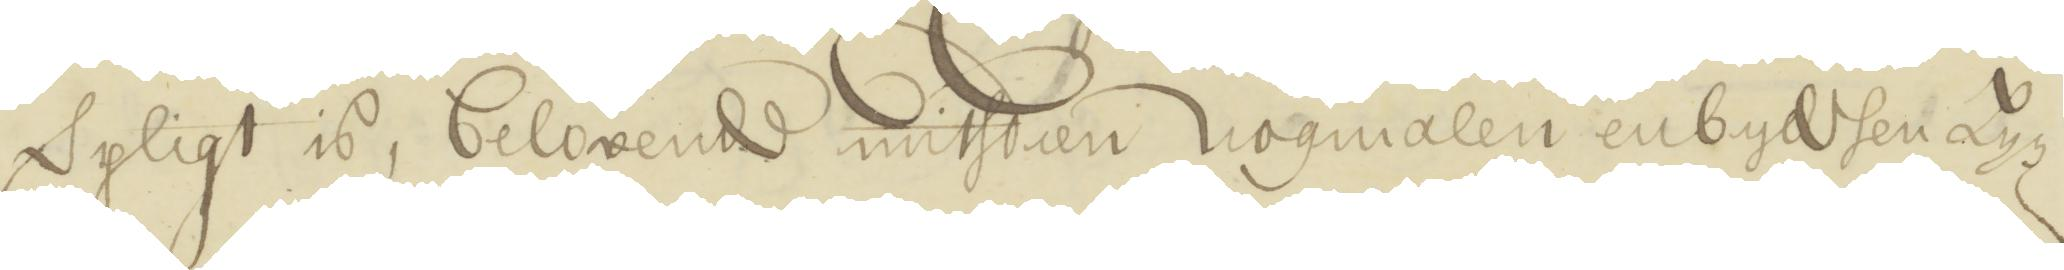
verpligt is, belovende mitsdien nogmalen en by desen Zyn
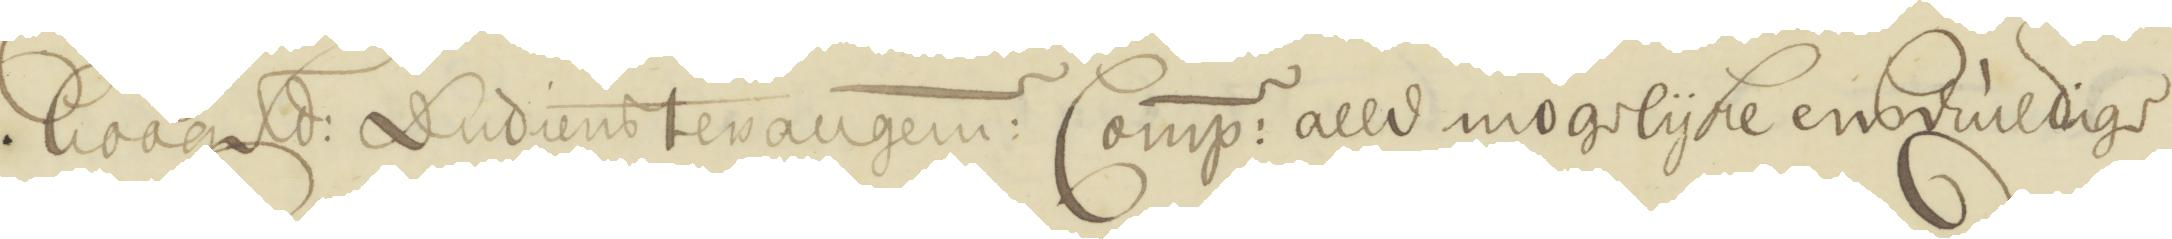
hoog Ed: ten dienste van gem: Comp:e alle mogelijke en schuldige
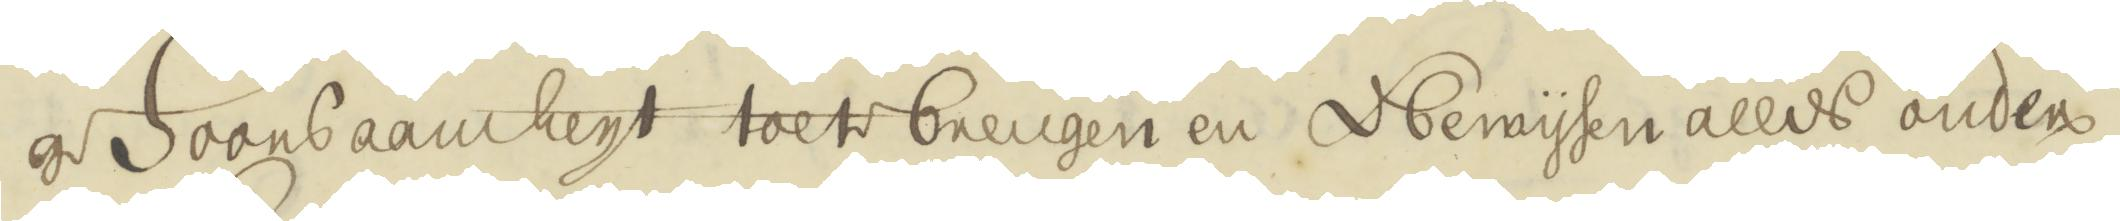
gehoorsaamheyt toe te brengen en te bewijsen alles onder
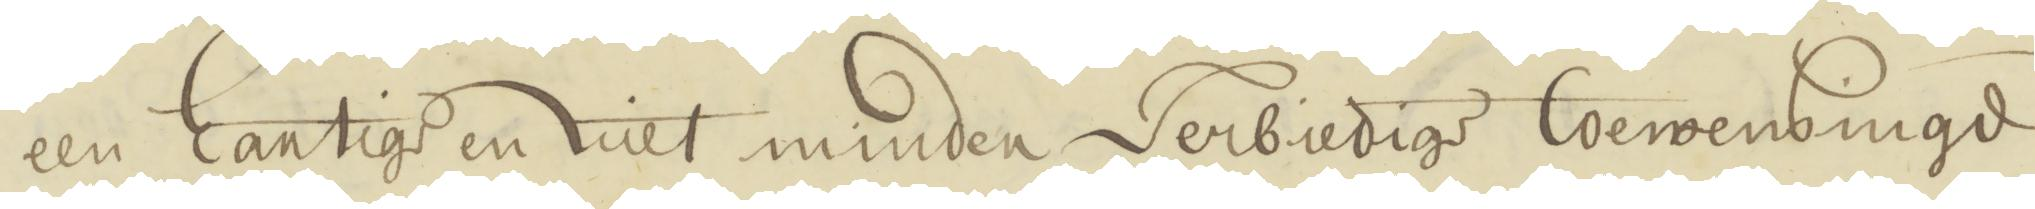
een hartig en niet minder Eerbiedige toewensinge
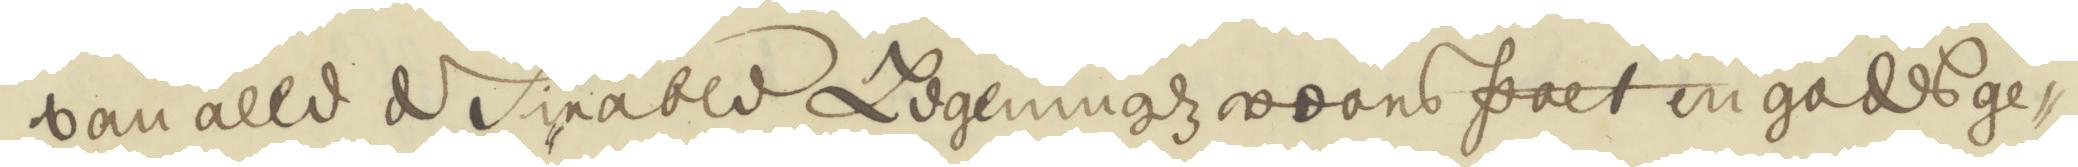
van alle desi„„derable Zegeningen voorspoet en godes ge„
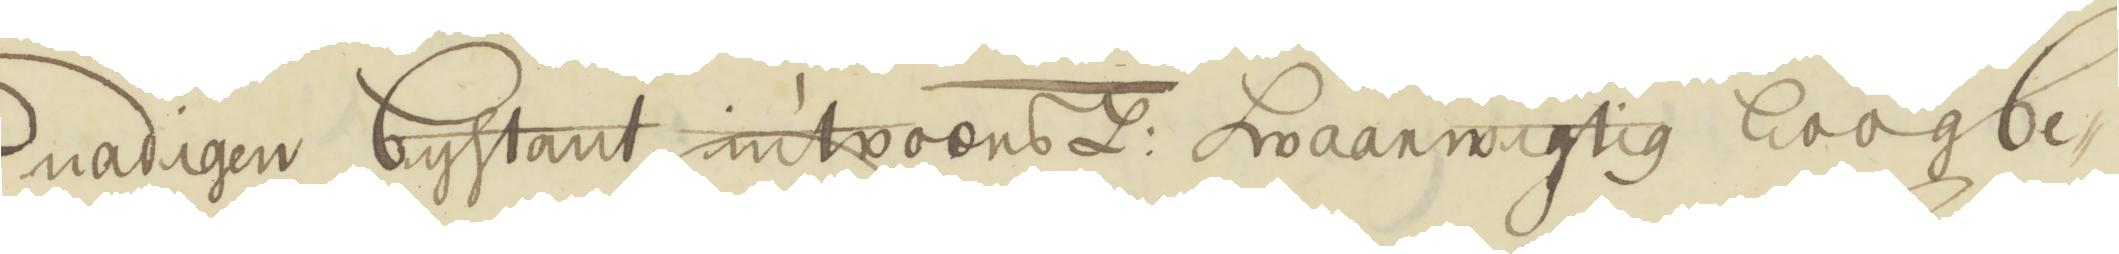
nadigen bystant in ’t voorsz: Swaarwigtig hoog be„
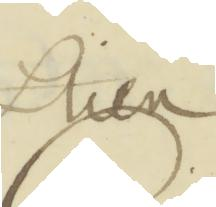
stier
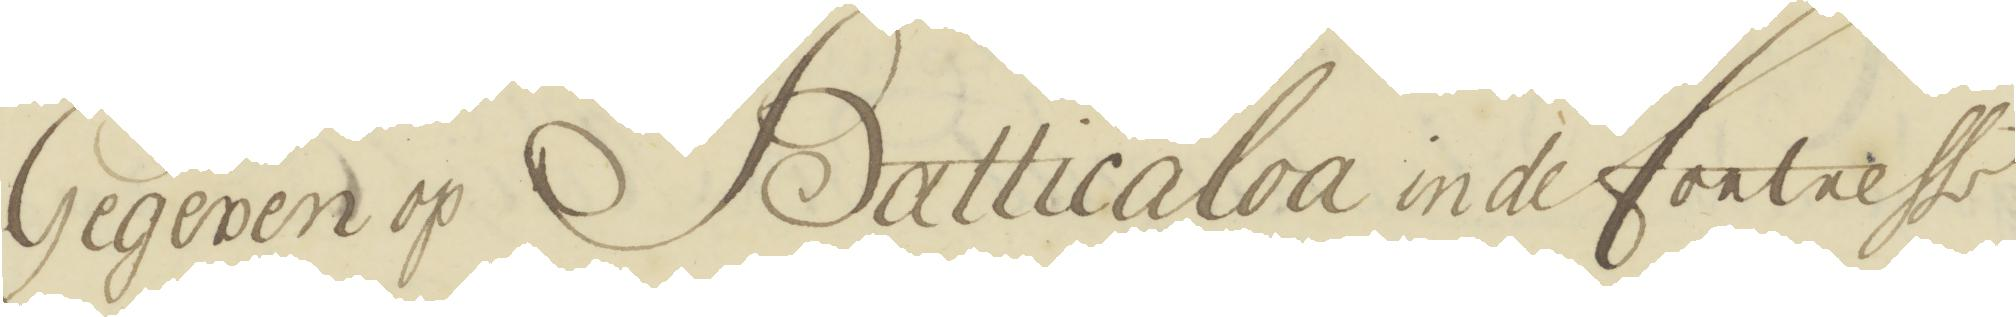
Gegeven op Batticaloa in de fortresse:
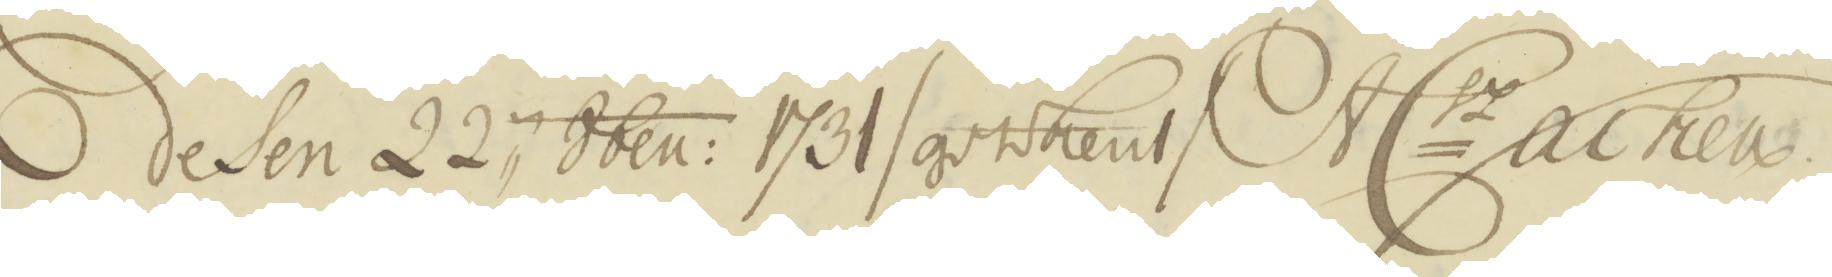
desen 22„en 8ber: 1731 / getekent/ A C=sz acker.
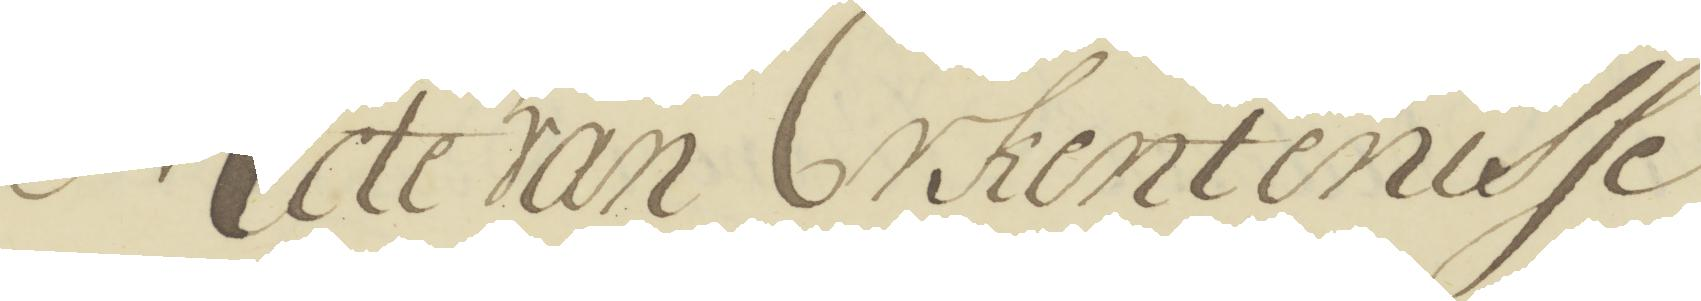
Acte van Erkentenisse
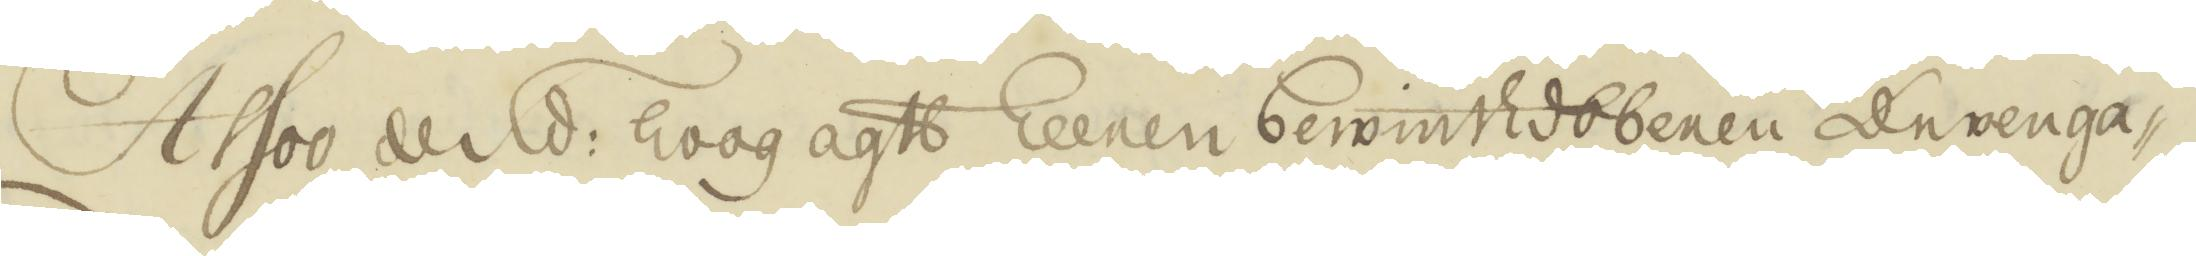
Alsoo de Ed: hoog agtb heeren bewinthebberen ter verga„
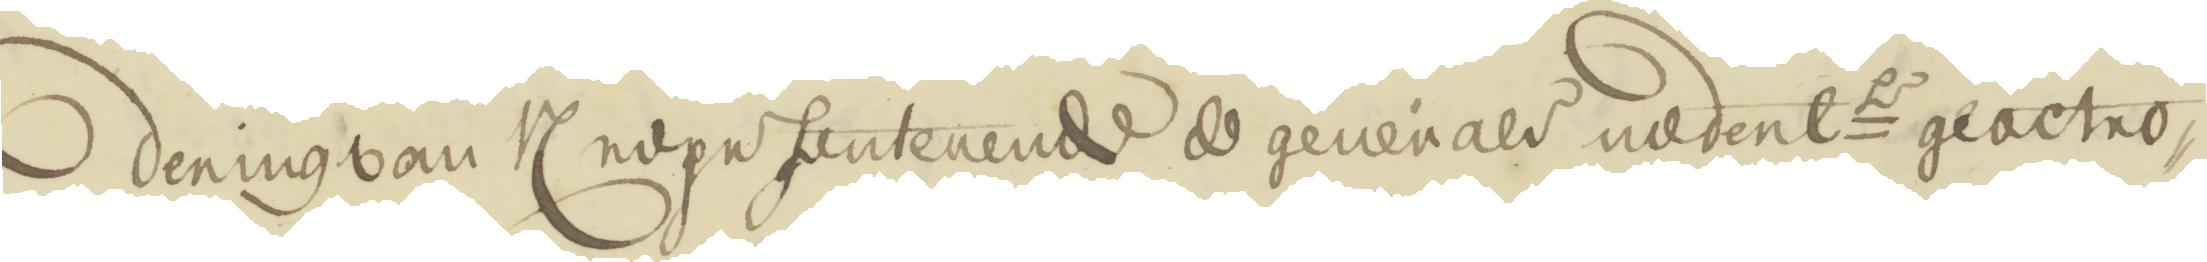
dering van 17 representerende de generale nederl=se geoctro„
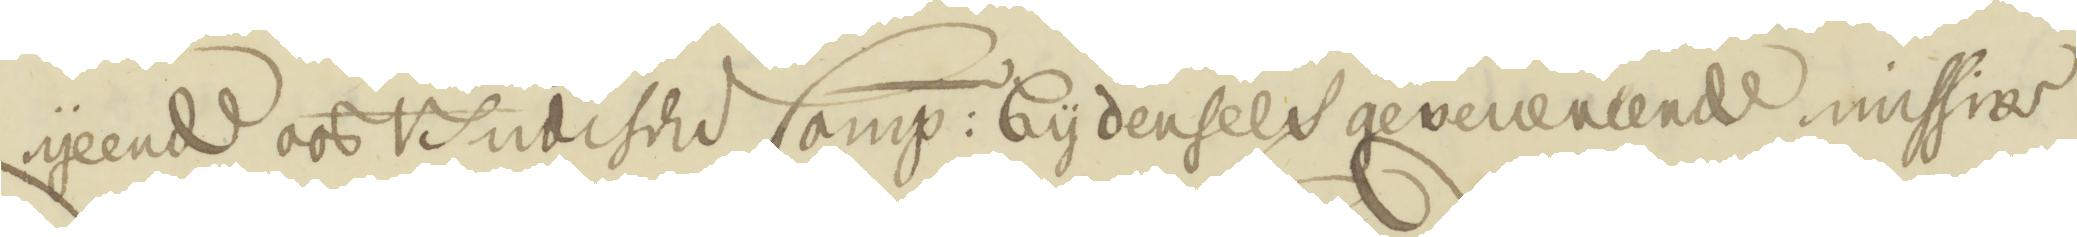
ijeerde oost Indische Comp:e bij derselver gevenereerde missive
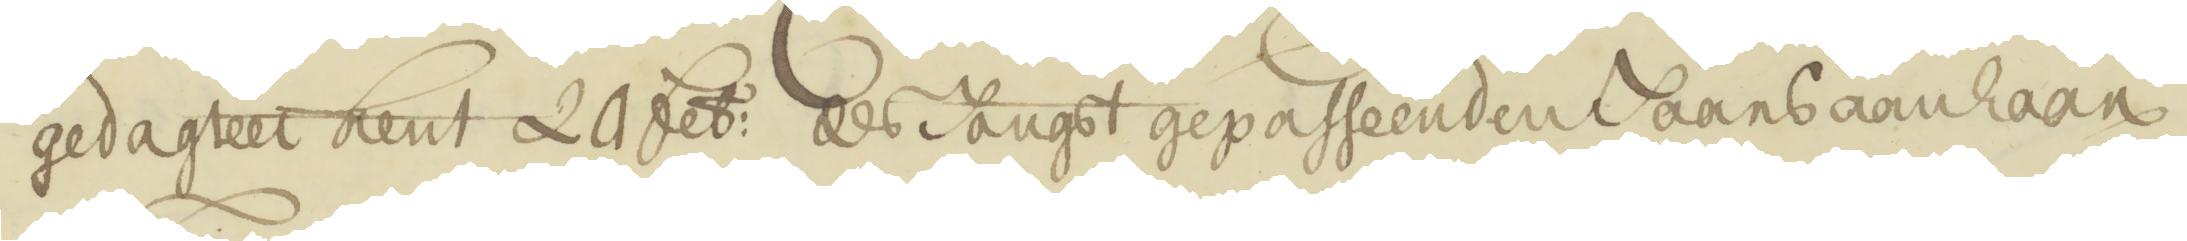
gedagteet kent 24 feb: des Iongst gepasseerden Iaars aan haar
